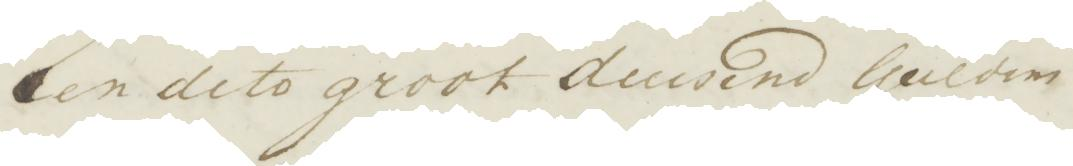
Een dito groot duisend Guldens
